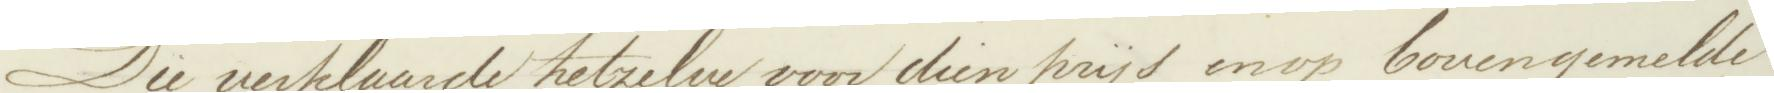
Die verklaarde hetzelve voor dien prijs enop bovengemelde
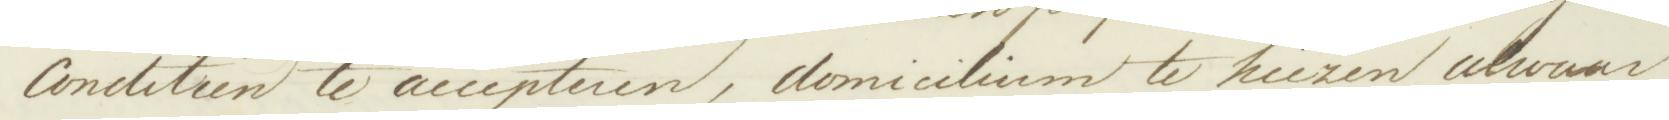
conditien te accepteren, domicilium te kiezen alwaar
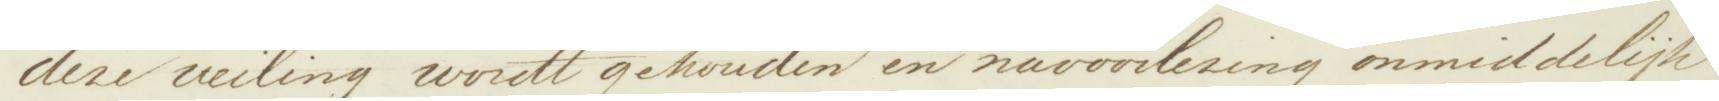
deze veiling wordt gehouden en navoorlezing onmiddelijk
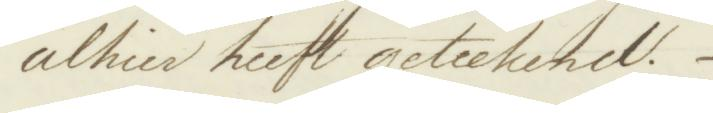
alhier heeft geteekend.
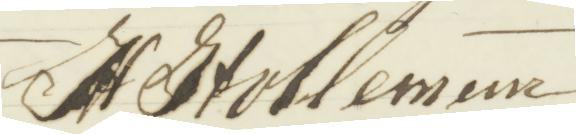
H.Holleman
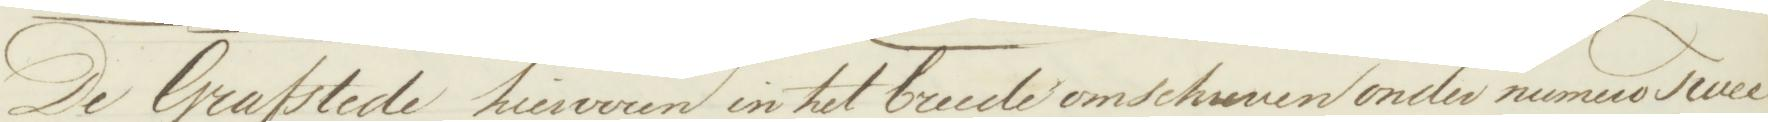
De Grafstede hiervoren in het breede omschreven onder numero Twee
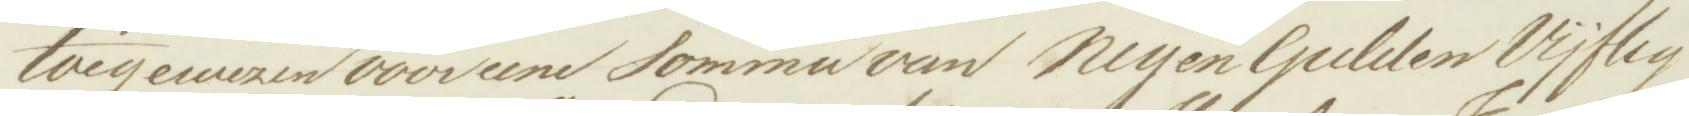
toegewezen voor eene somma van Negen Gulden Vijftig
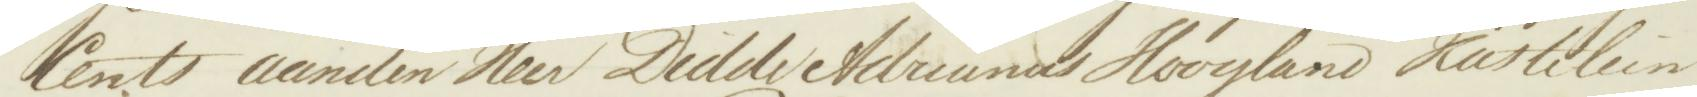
Cents aanden Heer Didde Adrianus Hoogland Kastelein
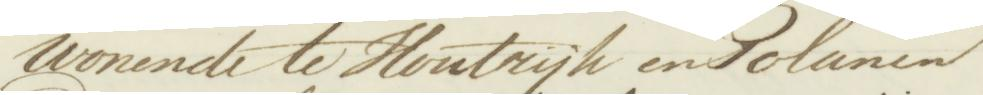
wonende te Houtrijk en Polanen
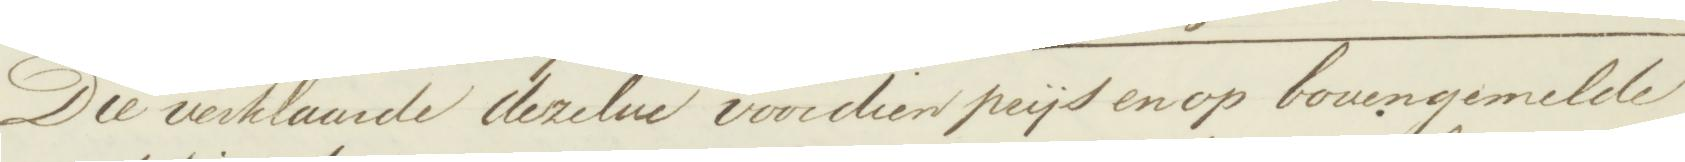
Die verklaarde dezelve voordien prijs en op bovengemelde
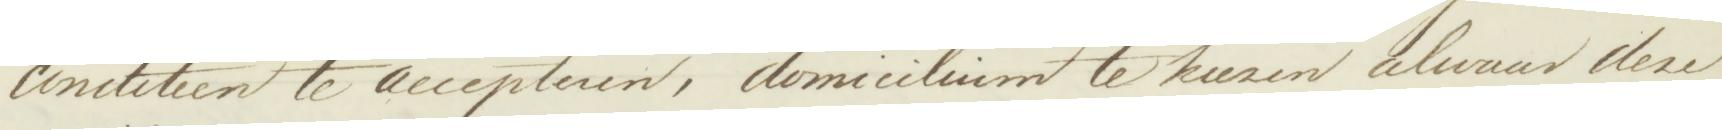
conditien te accepteren, domicilium te kiezen alwaar deze
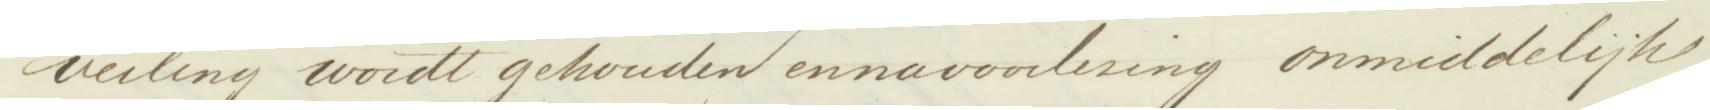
veiling wordt gehouden ennavoorlezing onmiddelijk
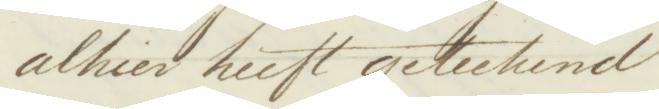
alhier heeft geteekend
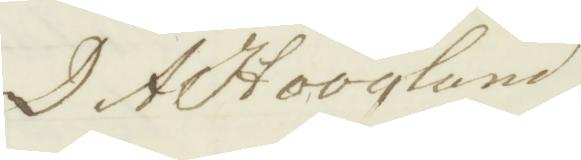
D A Hoogland
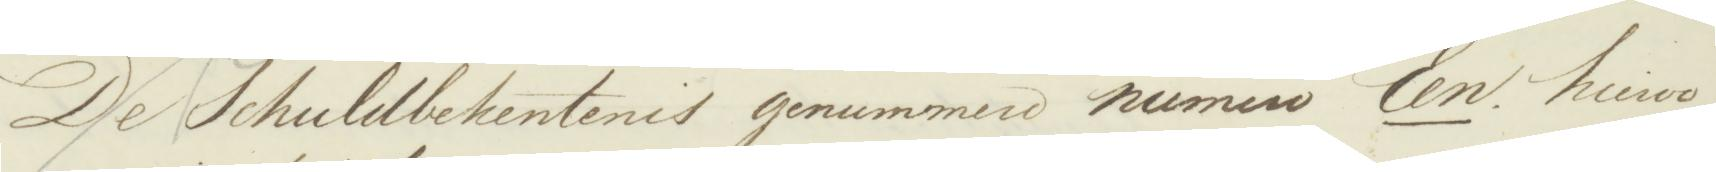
De Schuldbekentenis genummerd numero Een hiervo
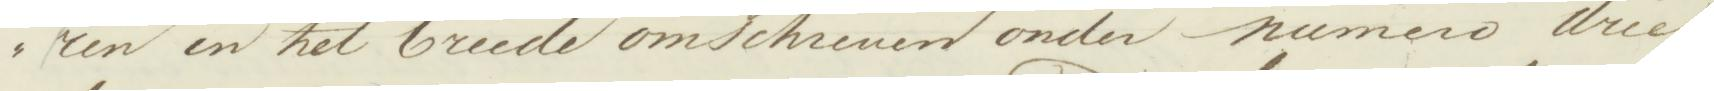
„ ren in het breede omschreven onder numero drie
